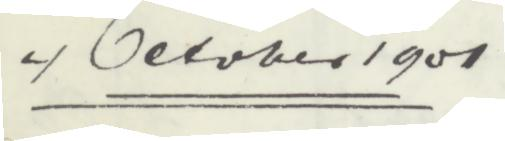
4 October 1901
